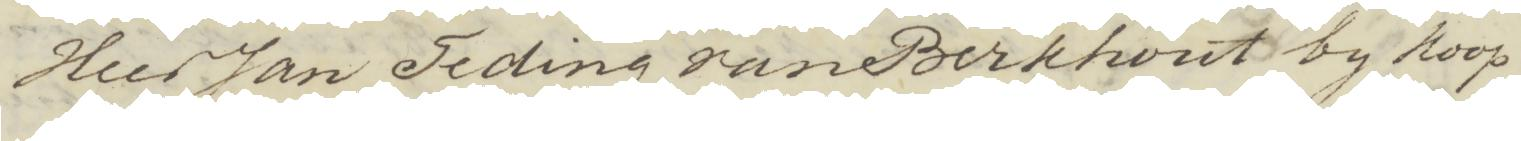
Heer Jan Teding van Berkhout by Koop
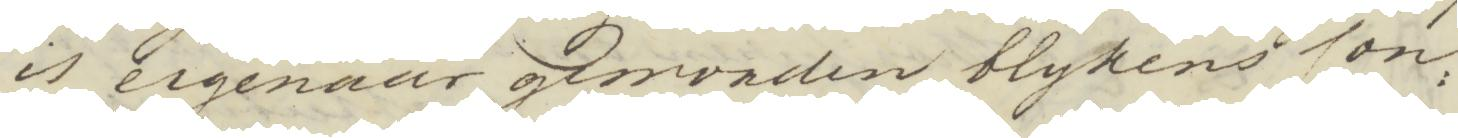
is eigenaar geworden blykens Con:
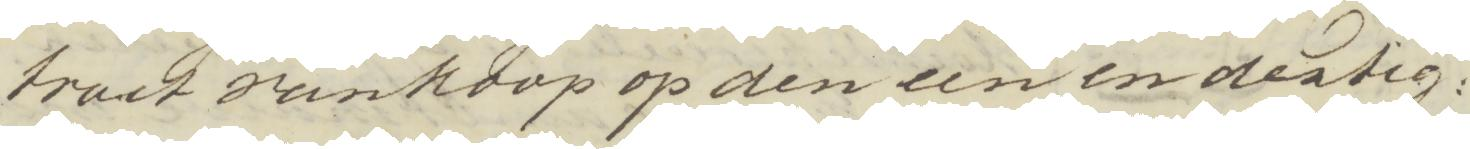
tract van koop op den een en dertig:
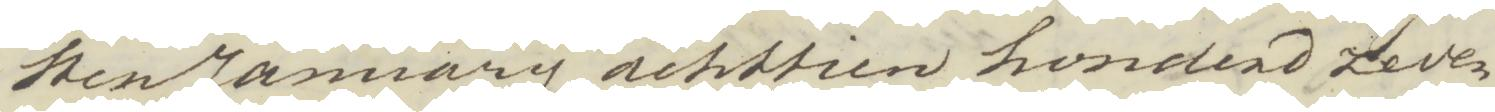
sten January achttien honderd zeven:
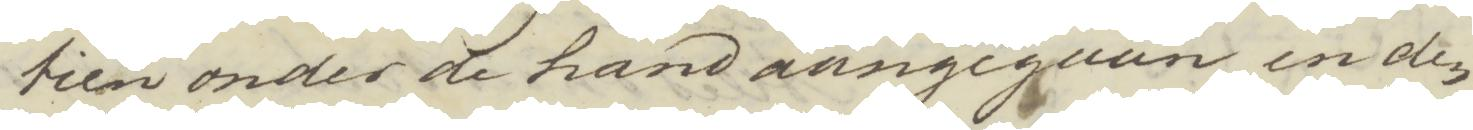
=tien onder de hand aangegaan, en den
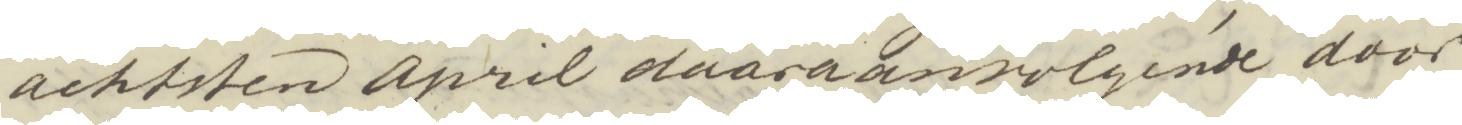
achtsten april daaraanvolgende door
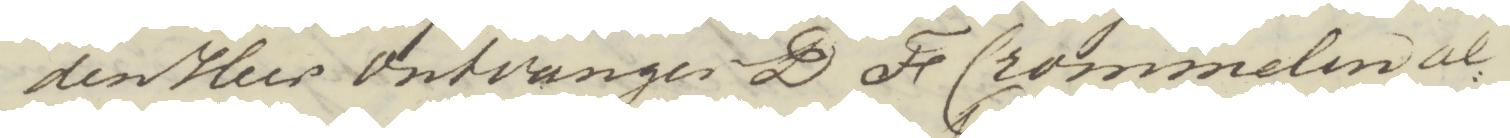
den Heer Ontvanger D F Crommelin al:
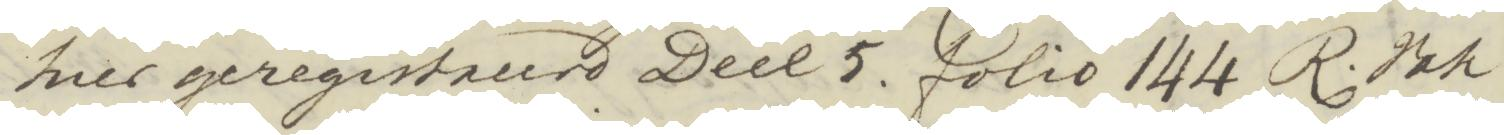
hier geregistreerd Deel 5. folio 144 R: vak
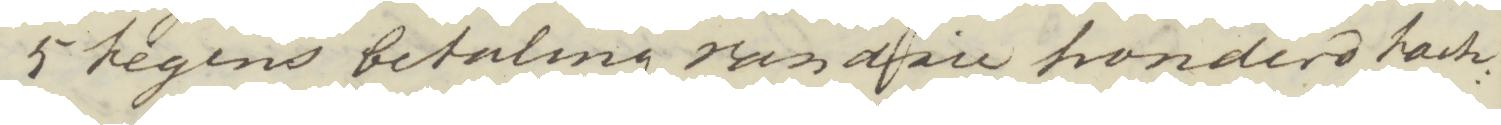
5 tegens betaling van drie honderd tach:
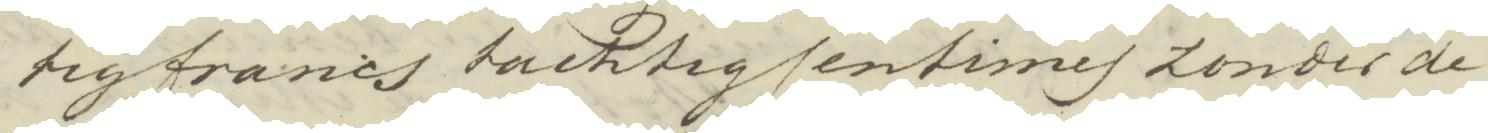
tig francs tachtig Centimes zonder de
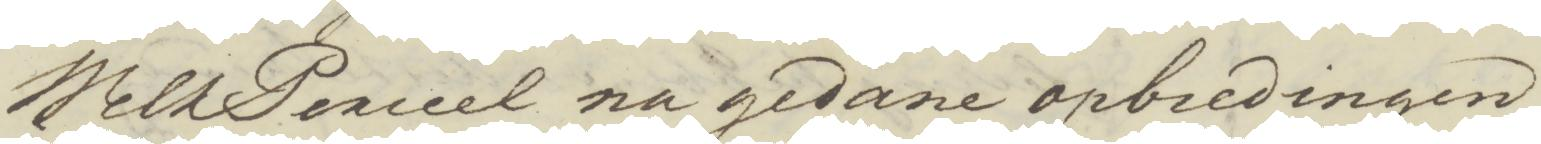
Welk Perceel na gedane opbiedingen
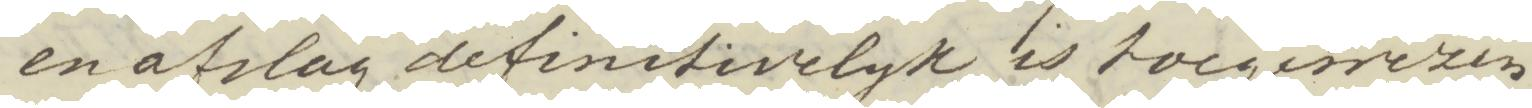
en afslag definitivelyk is toegewezen
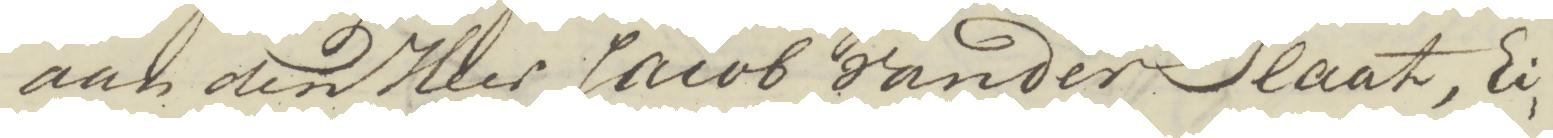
aan den Heer Jacob vander Plaat, Ei:
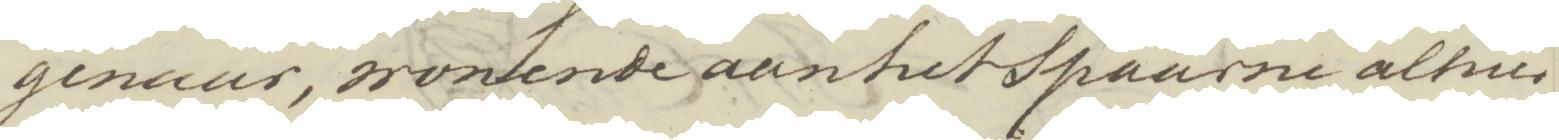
genaar, wonende aan het Spaarne alhier
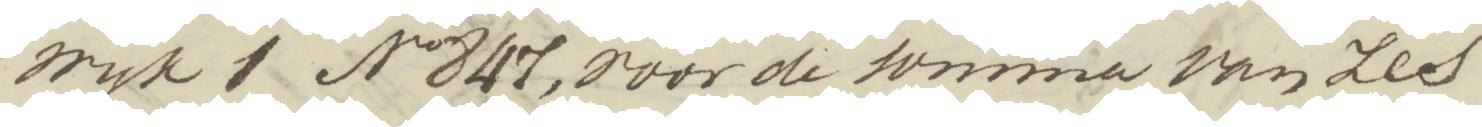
wyk 1 No 847, voor de somma van Zes
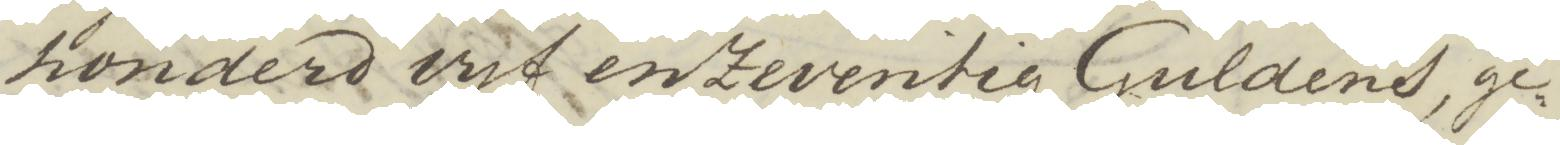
honderd vyf en zeventig Guldens, ge:
